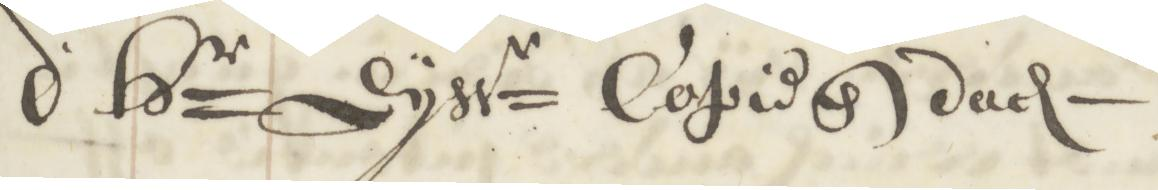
d’ H=r Eijss=r Copies dach
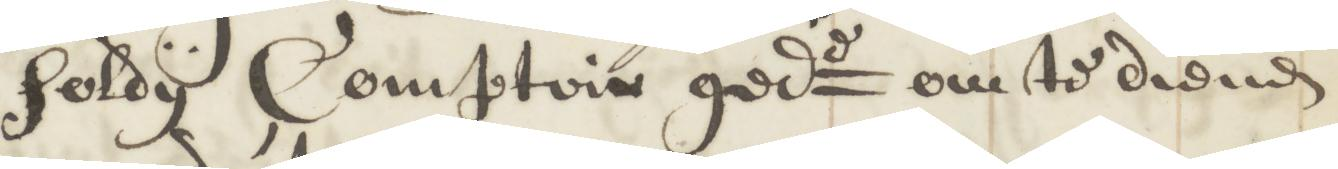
soldij Comptoir ged=e om te dienen
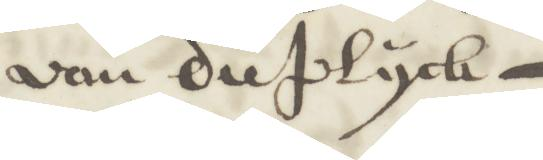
van duplijck —
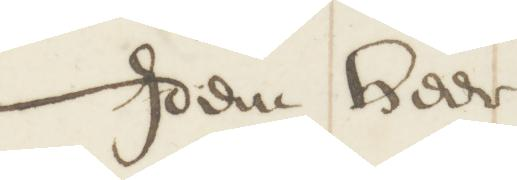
Jdem Heer
